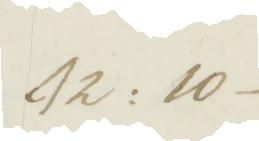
42: 10 —
